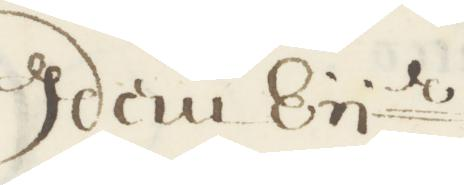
Jdem Eij=r
